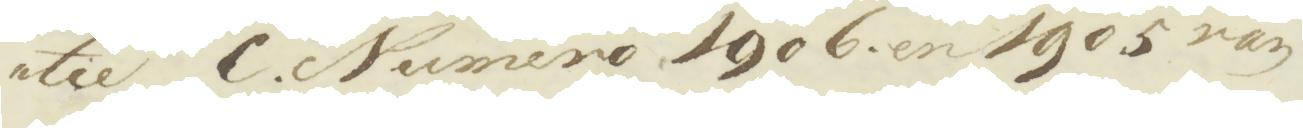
tie C. Numero 1906. en 1905 van
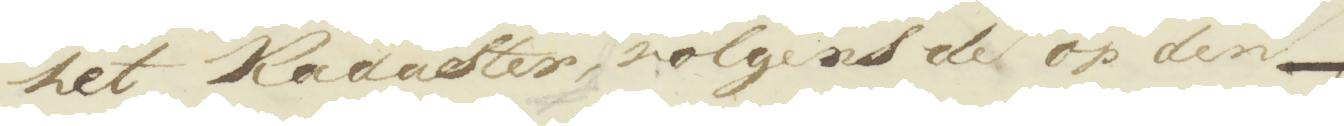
het Kadaster, volgens de op den
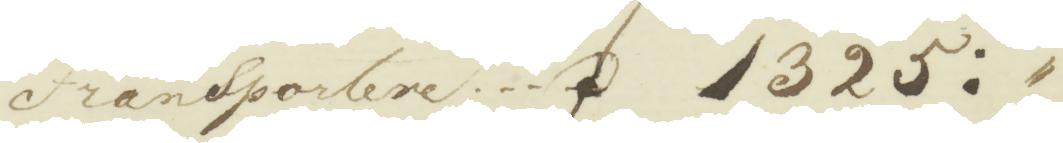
Transportere - - - ƒ 1325: „
